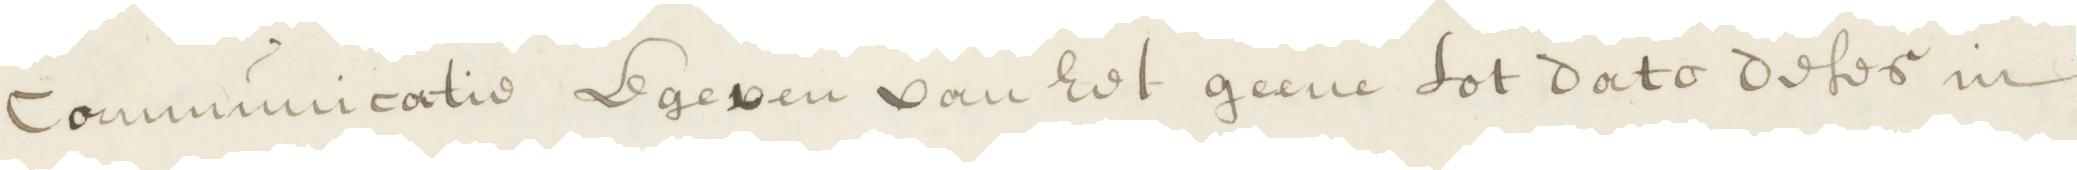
communicatie te geven van het geene tot dato deses in
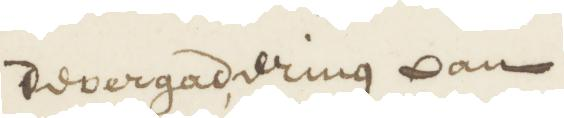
de vergadering van
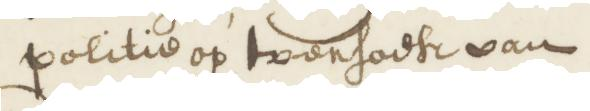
politie op 't versoek van
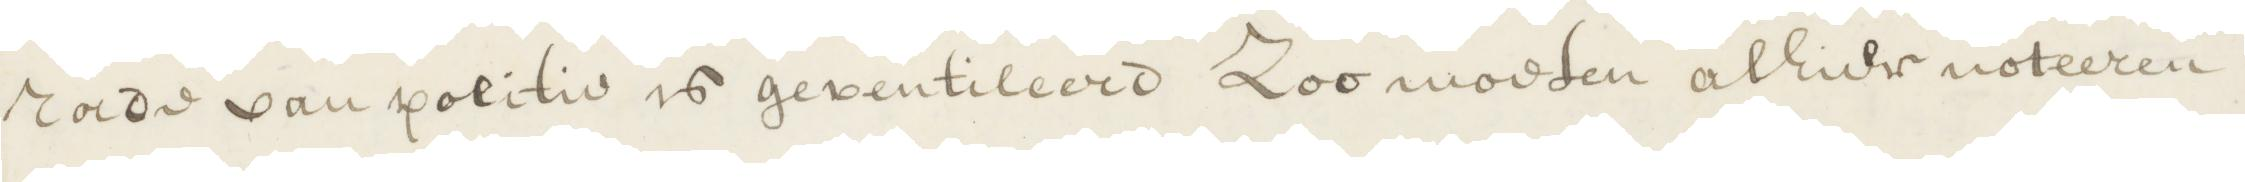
rade van politie is geventileerd zoo moeten alhier noteeren
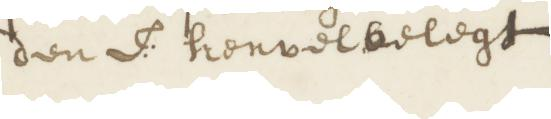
den E: kervel belegt
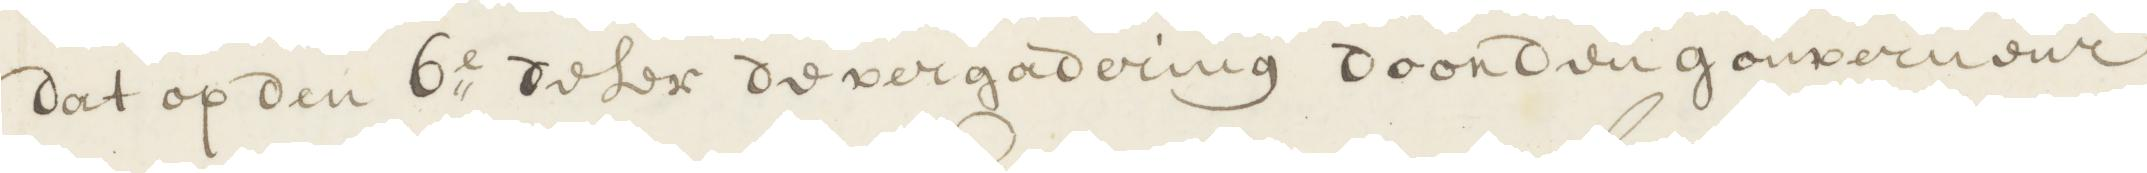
dat op den 6„e deser de vergadering door den gouverneur
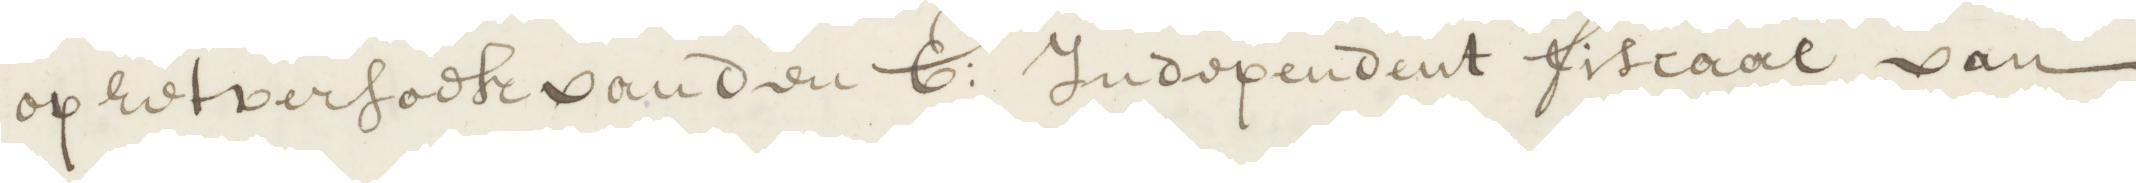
op het versoek van den E: Jndependent fiscaal van
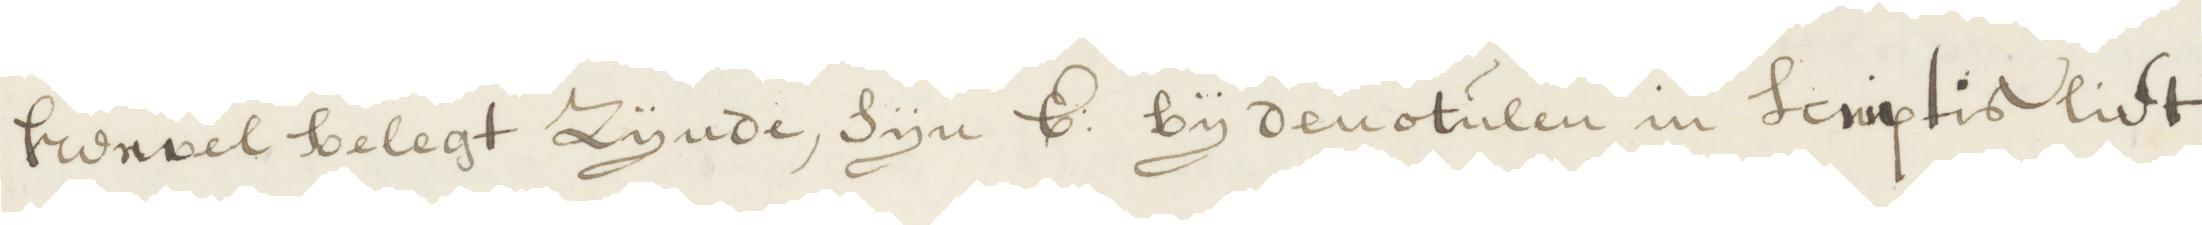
kervel belegt zijnde, sijn E: bij de notulen in scriptis liet
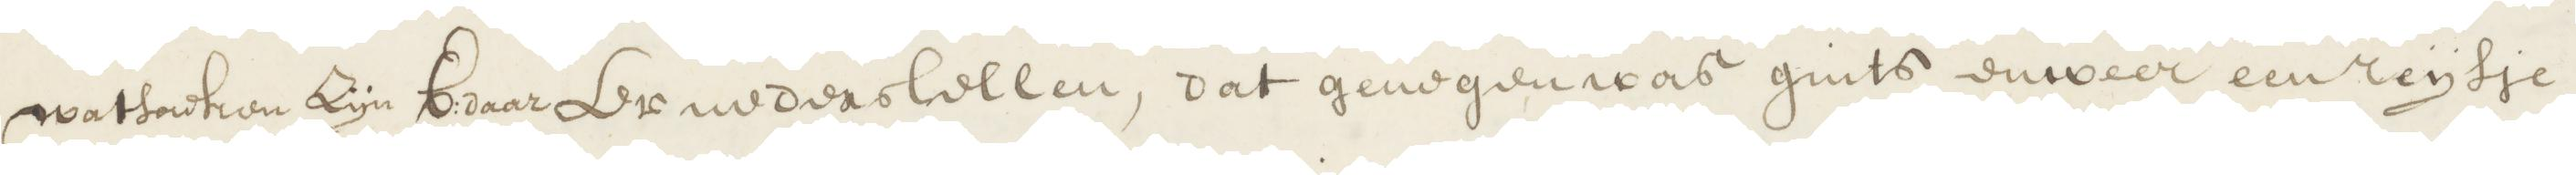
wat saeken zijn E: daar ter nederstellen, dat genegen was gints en weer een reijsje
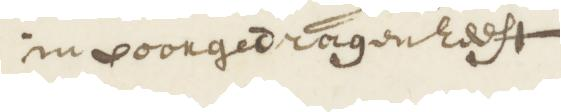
in voorgedragen heeft
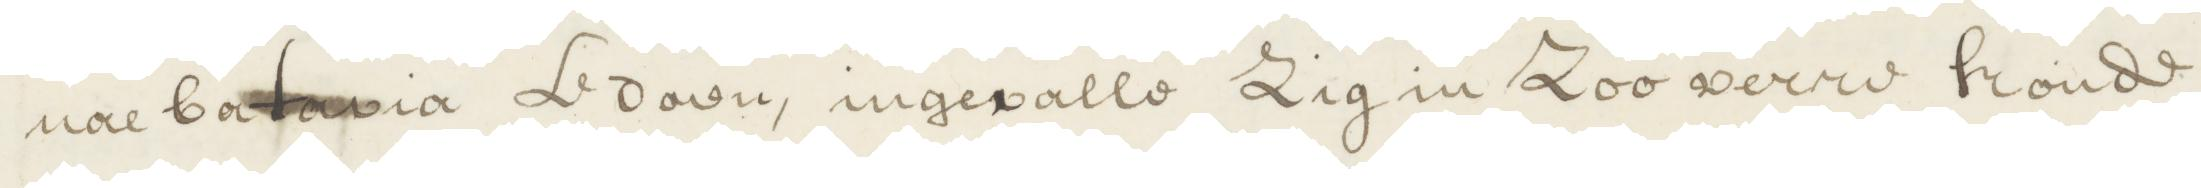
nae batavia te doen, in gevalle zig in zoo verre konde
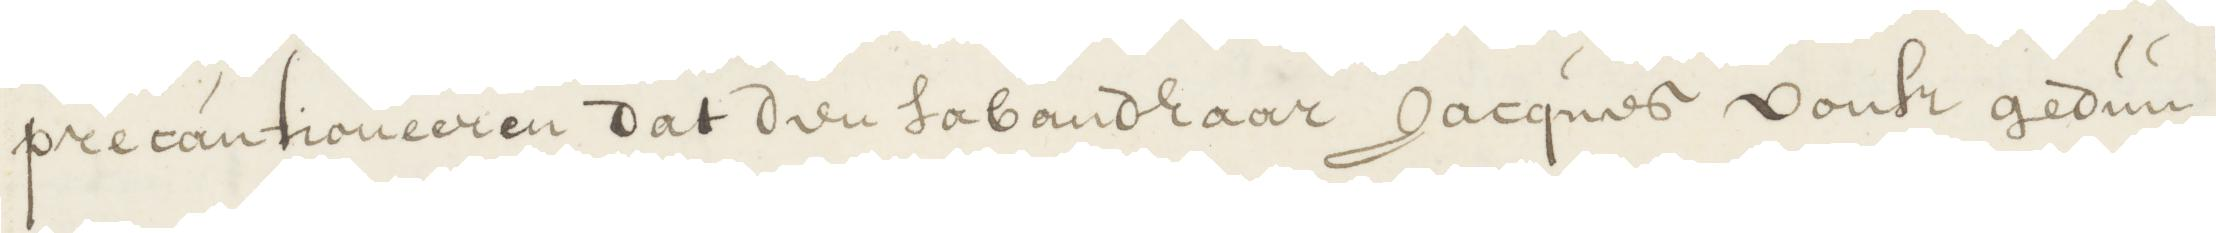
precautioneeren dat den sabandhaar jacques vonk geduu
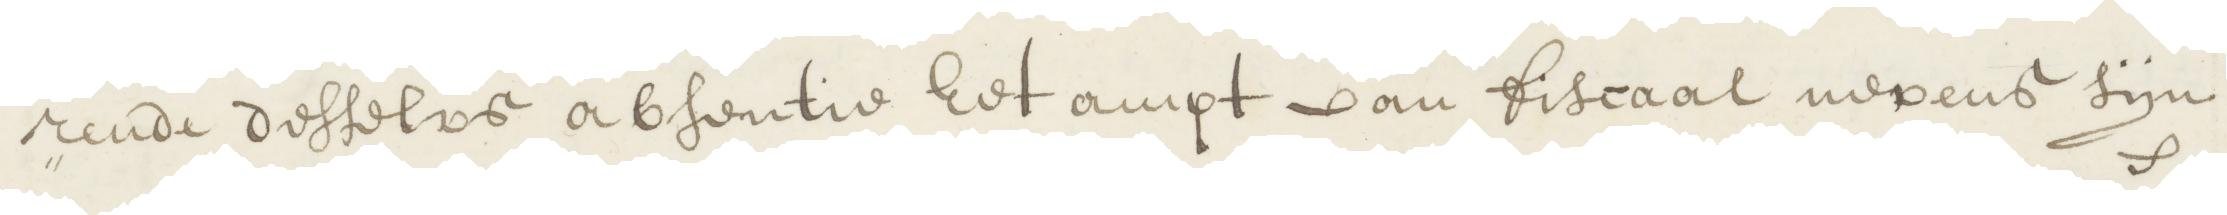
rende desselvs absentie het ampt van fiscaal nevens sijn
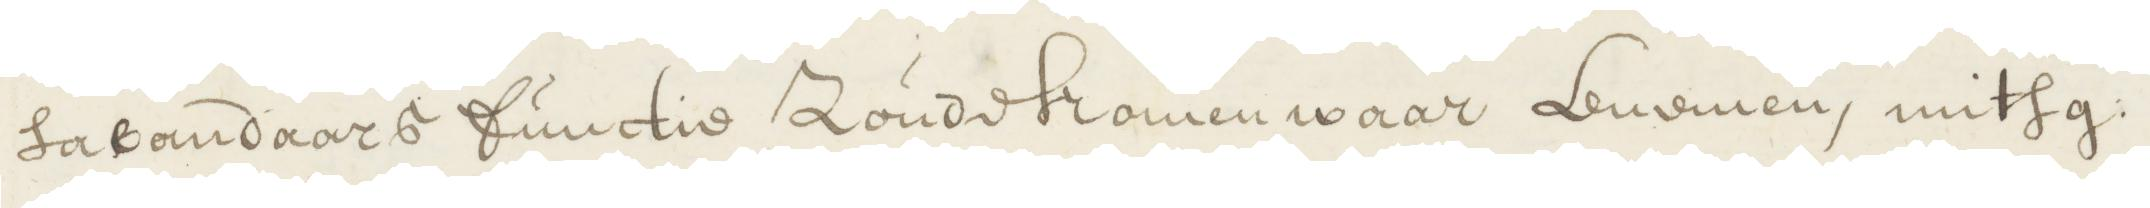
sabandaars functie Zoude komen waar te nemen, mitsg:s
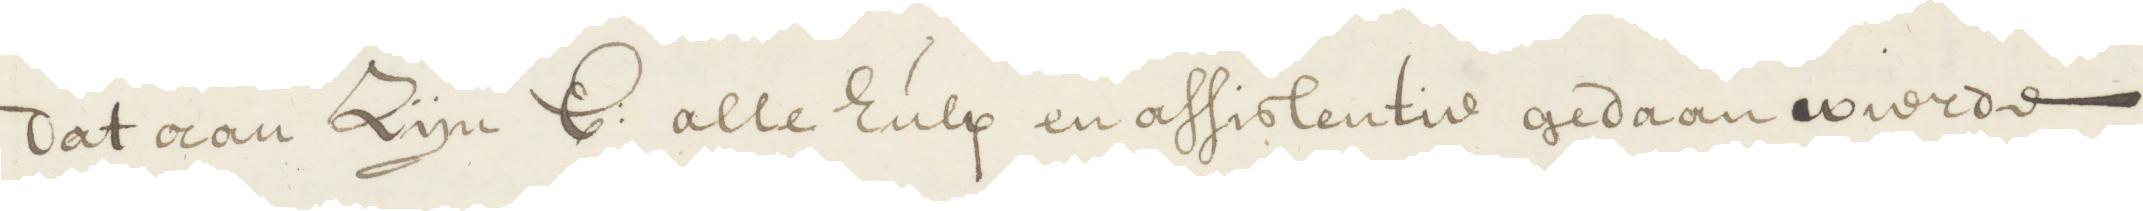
dat aan Zijn E: alle hulp en assistentie gedaan wierde
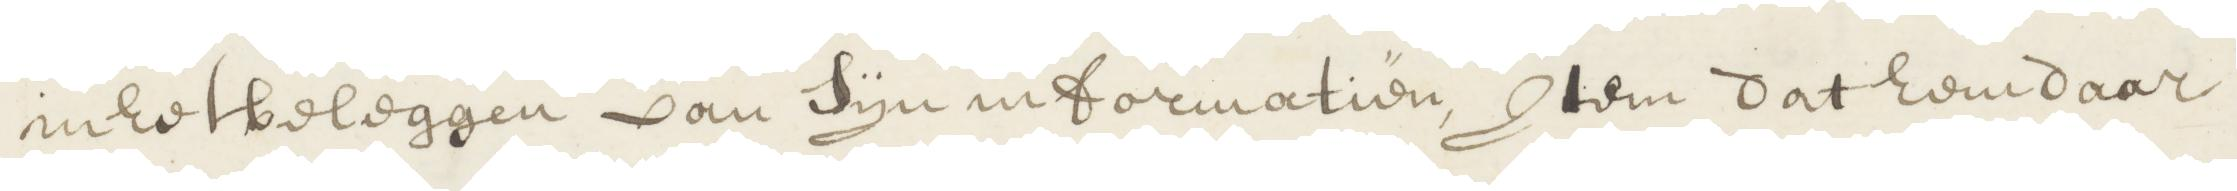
in het beleggen van sijn informatiën, jtem dat hem daar
